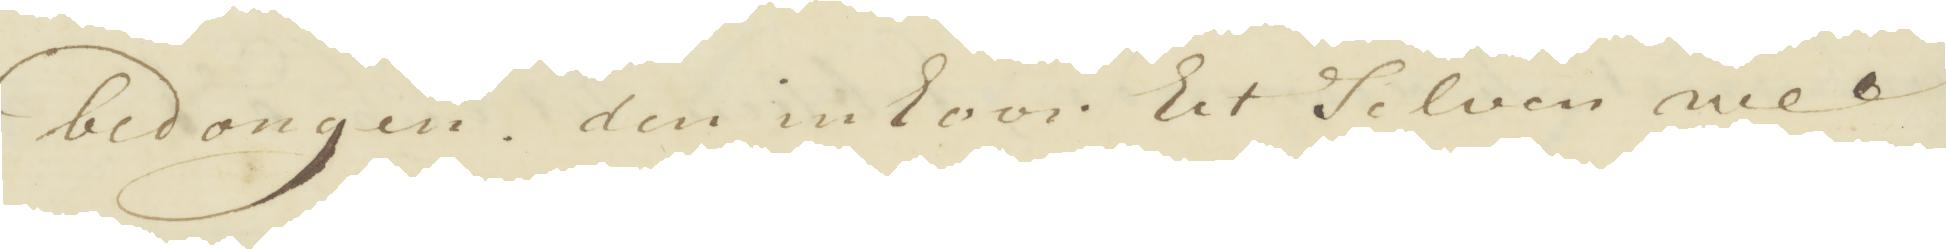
bedongen den inhoor het Selven wel
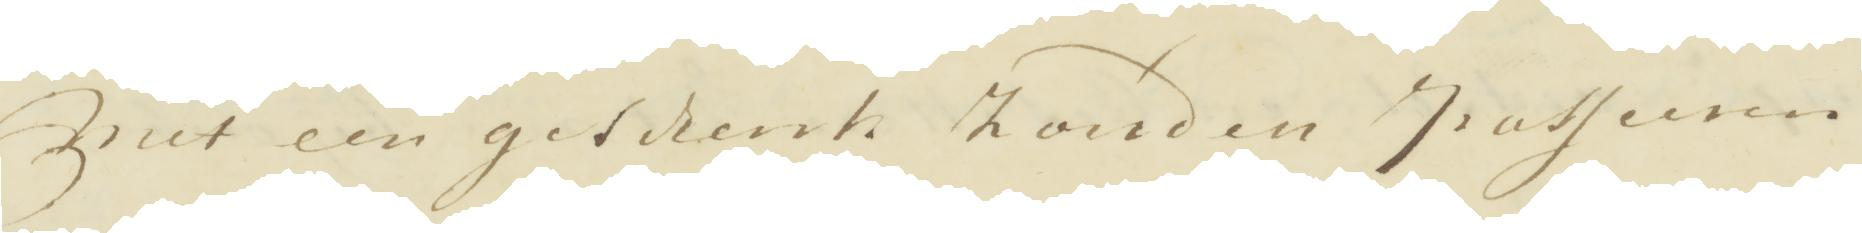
met een geschenk Zouden passeeren.
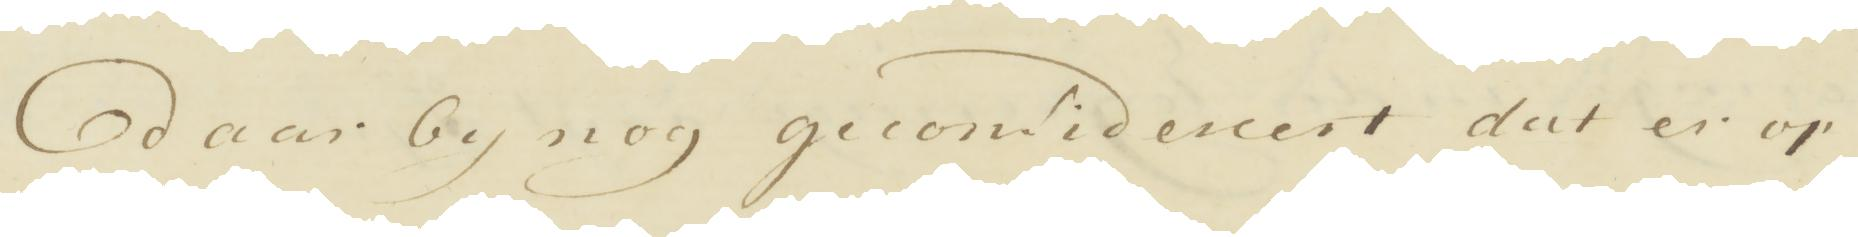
daar by nog geconsidereert dat er op
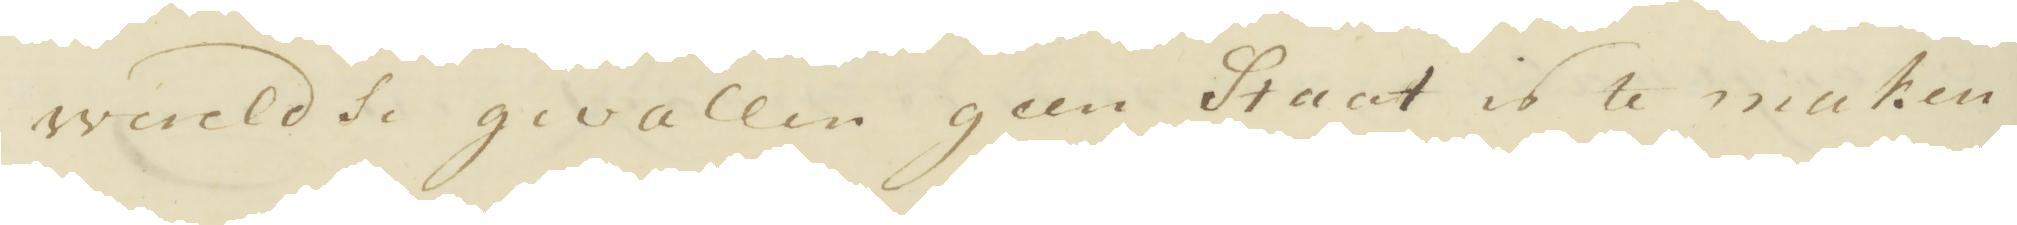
wereldse gevallen geen Staat is te maken
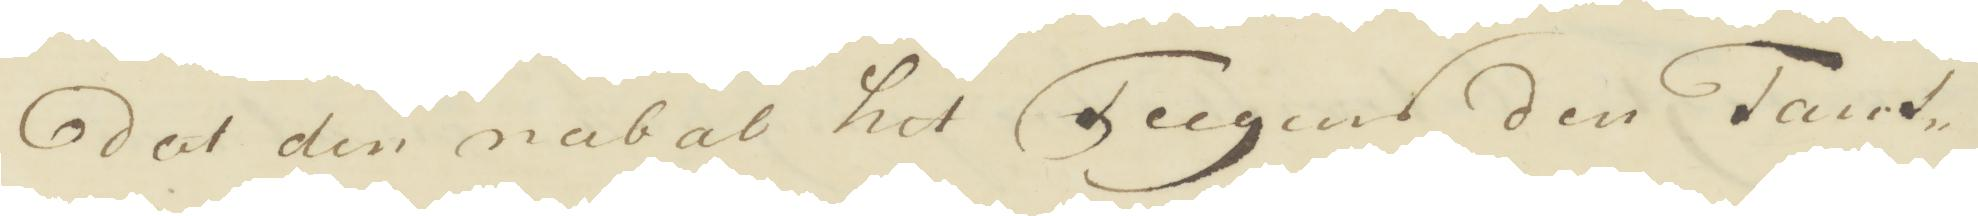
dat den nabab het Teegens den Tans„
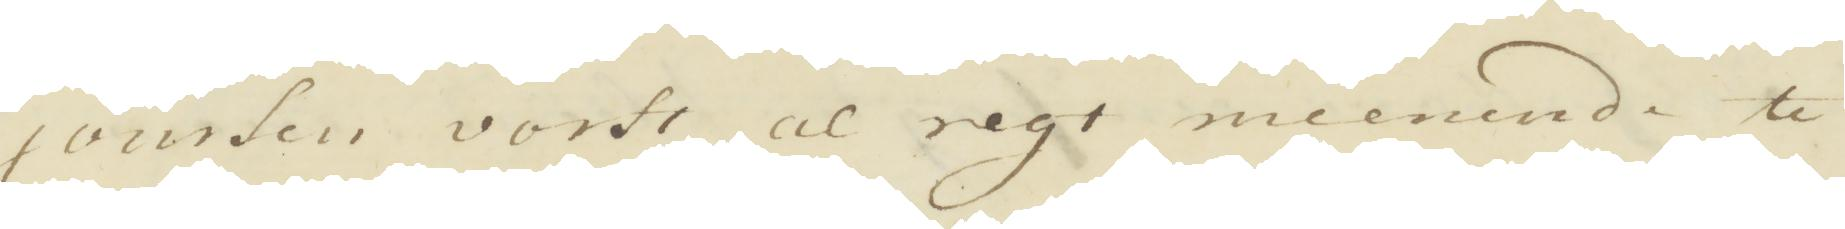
joursen vorst al regt meenende, te
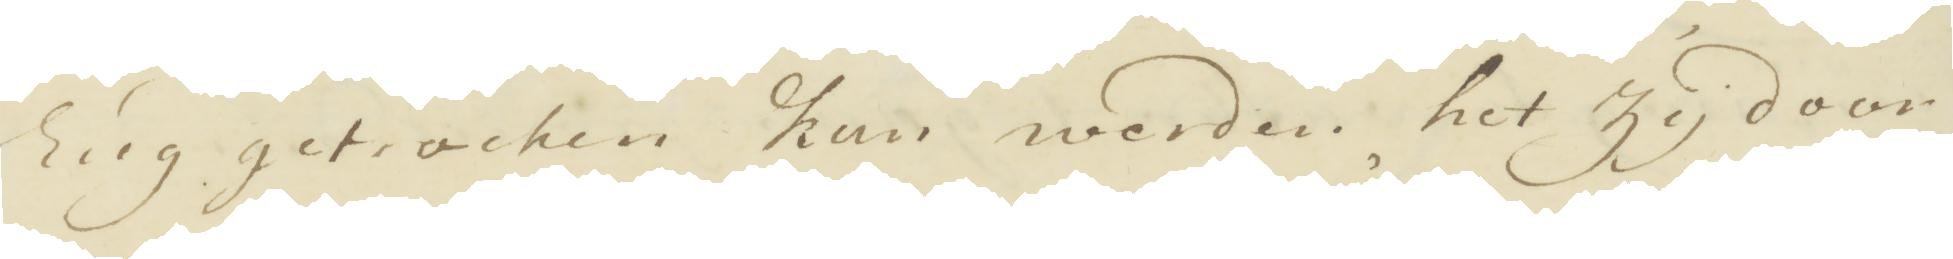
rug getrocken kan werden het zij door
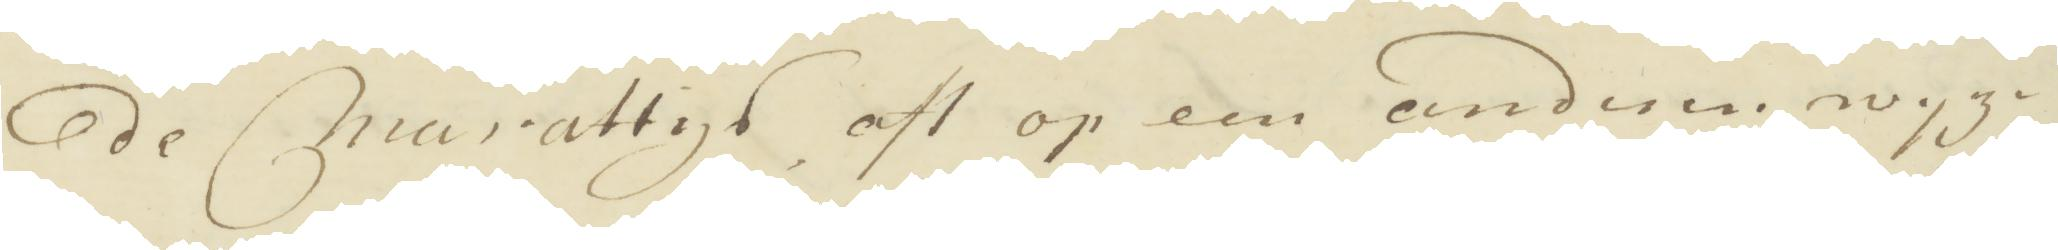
de marattijs oft op een anderen wyze
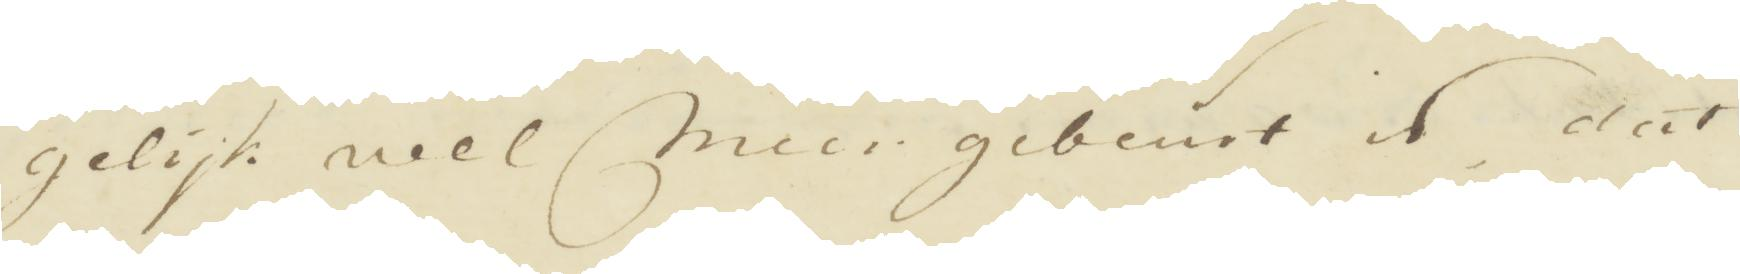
gelijk wel meer gebeurt is, dat
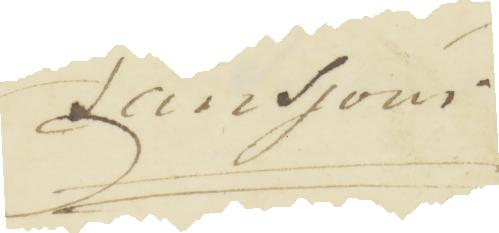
Tansjour
